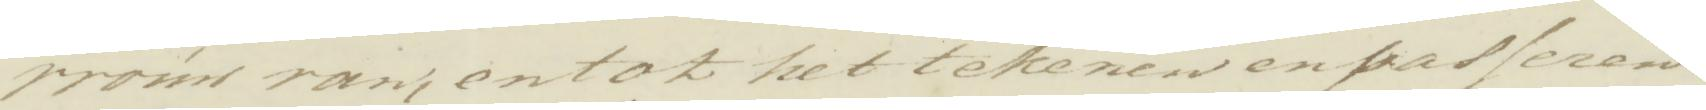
vrouw van, en tot het tekenen en passeren
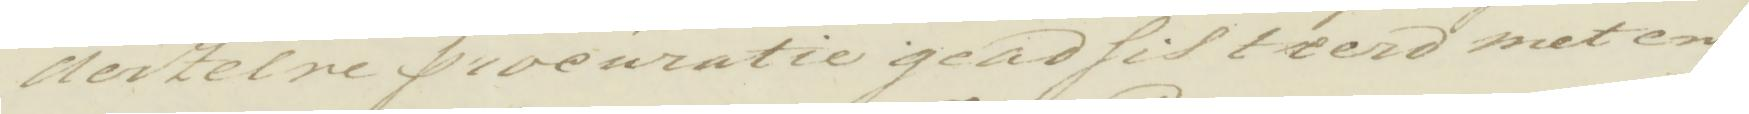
derzelve procuratie geadsisteerd met en
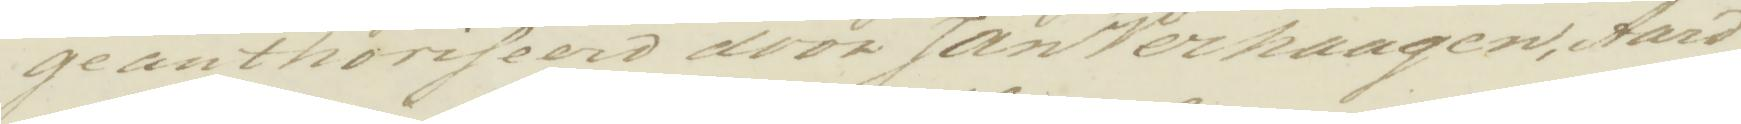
geauthoriseerd door Jan Verhaagen, Aard
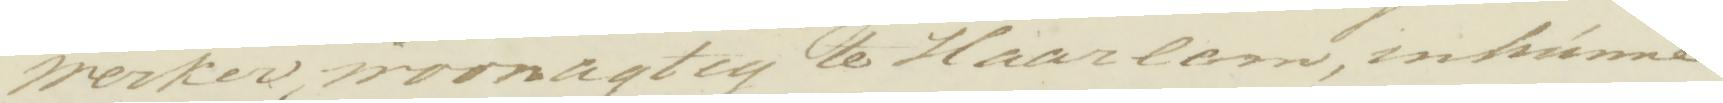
werker, woonagtig te Haarlem, in hume
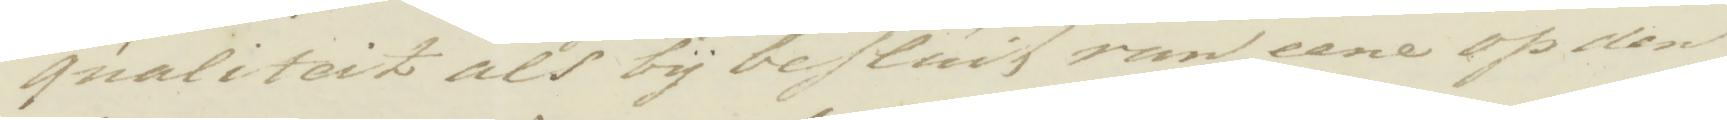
qualiteit als bij besluit van eene op den
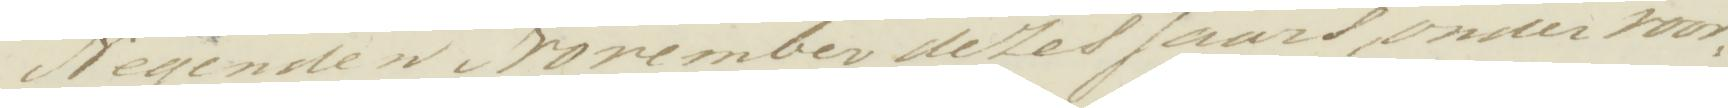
Negenden November dezes Jaars, onder voort„
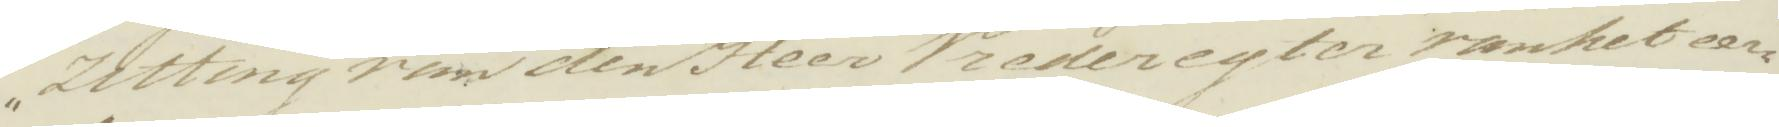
„zetting van den Heer Vrederegter van het eer
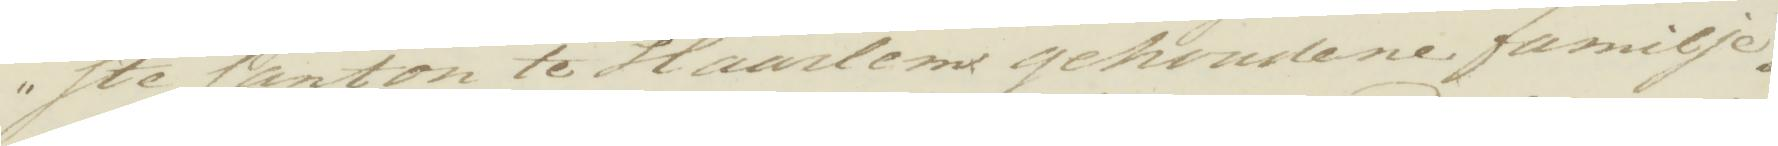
„ste Canton te Haarlem gehoudene familje„
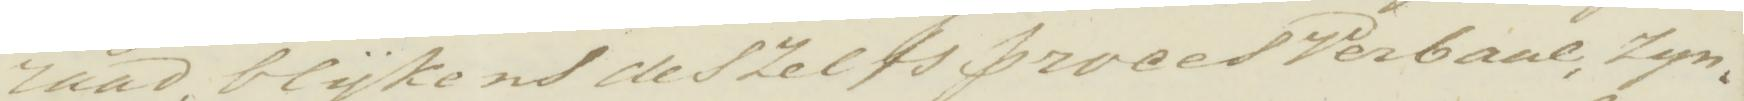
raad, blijkens deszelfs proces Verbaal, zyn„
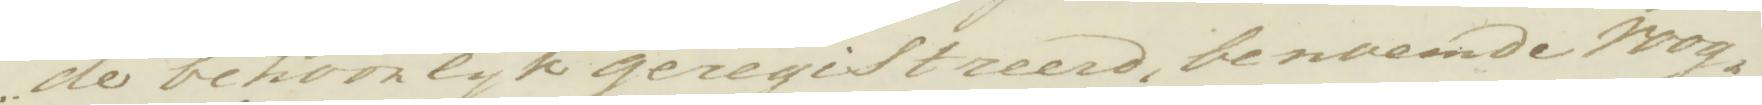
„de behoorlyk geregistreerd, benoemde Voog„
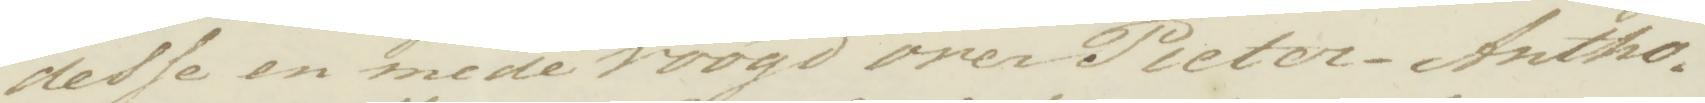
desse en mede voogd over Pieter-Antho„
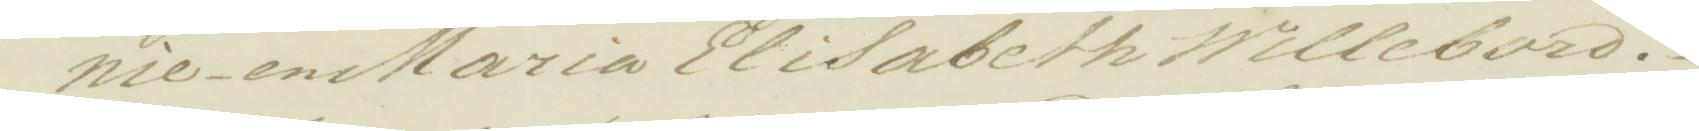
nie- en Maria Elisabeth Willebord._
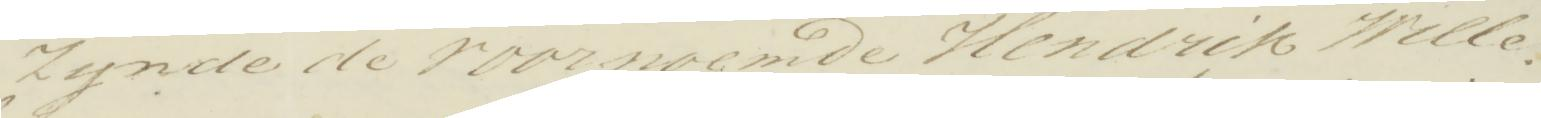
Zynde de voornoemde Hendrik Wille„
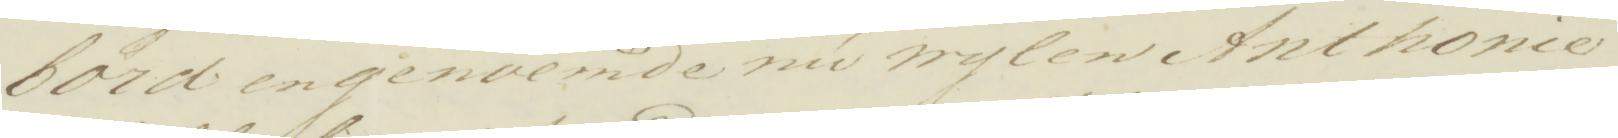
bord en genoemde nu wylen Anthonie
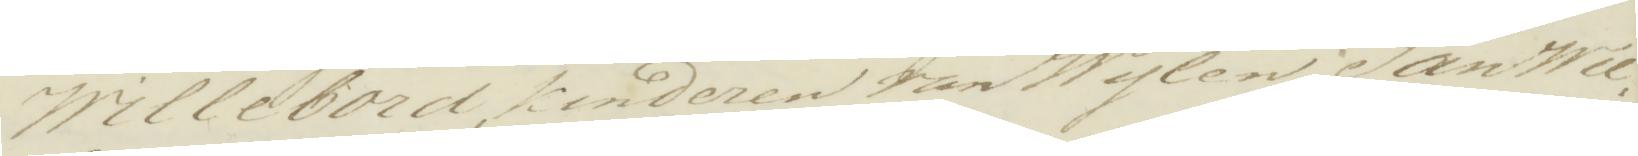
Willebord, kinderen van Wylen Jan Wil„
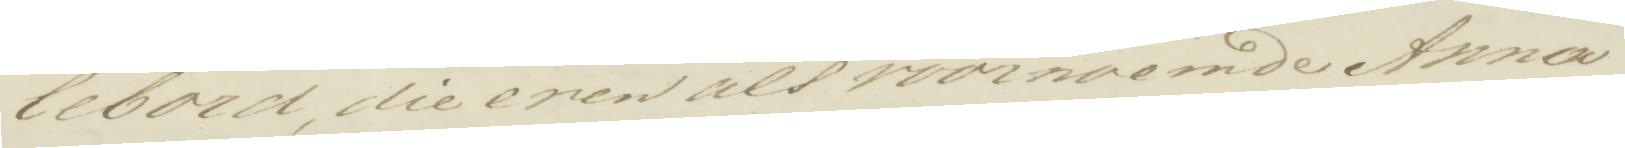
lebord, die even als voornoemde Anna
